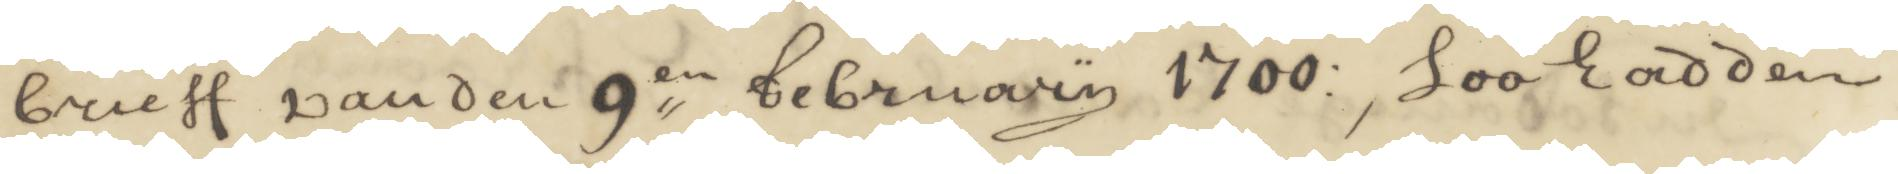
brieff van den 9„en februaij 1700:, soo hadden
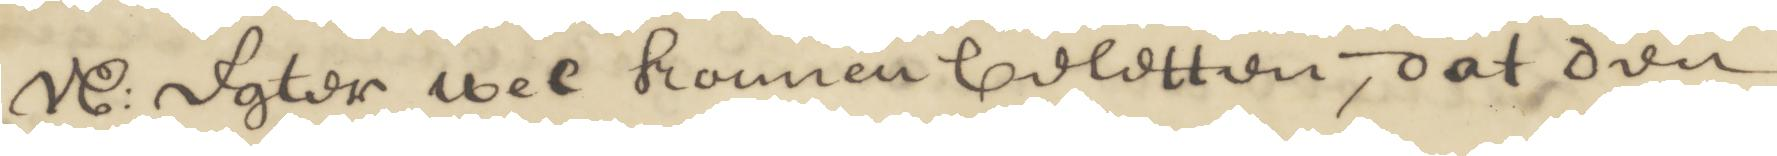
UE: egter wel konnen beletten, dat den
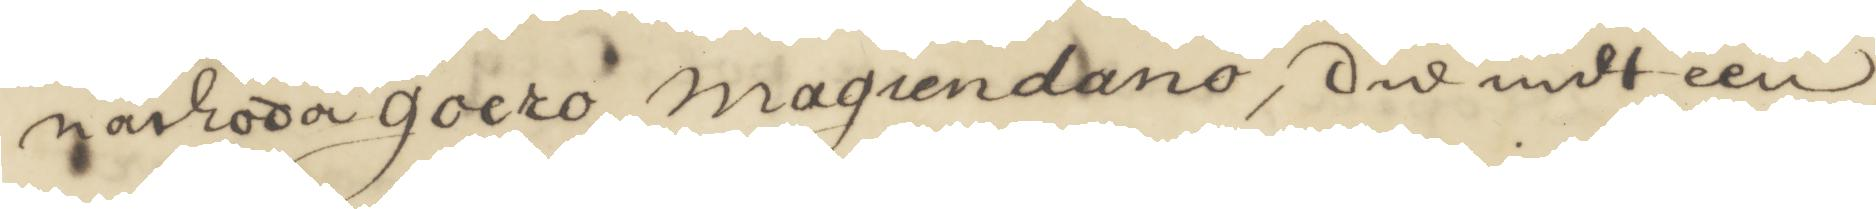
nachoda goero magiendano, die met een
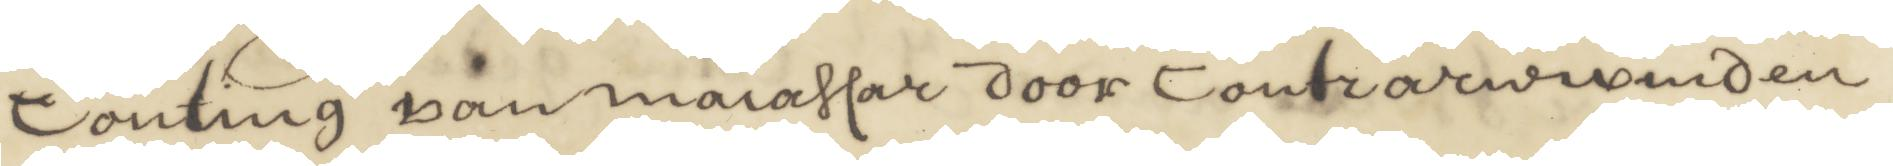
Conting van macassar door contrariewinden
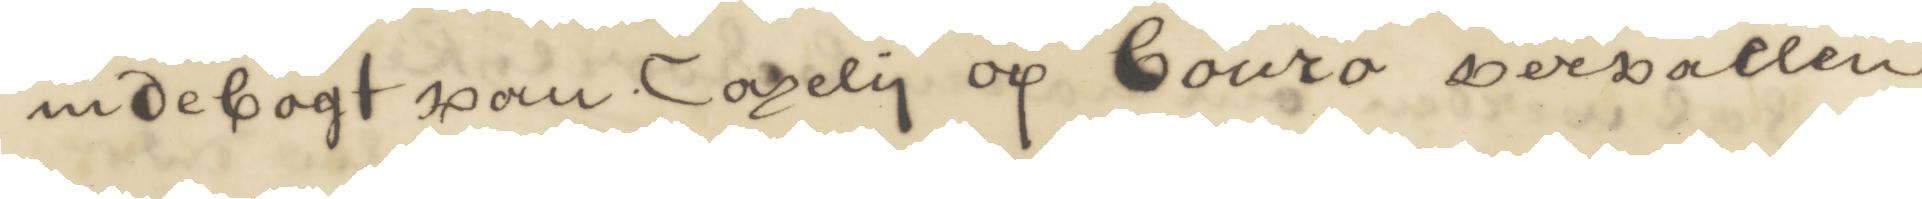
in de bogt van Cayelij op Bouro vervallen
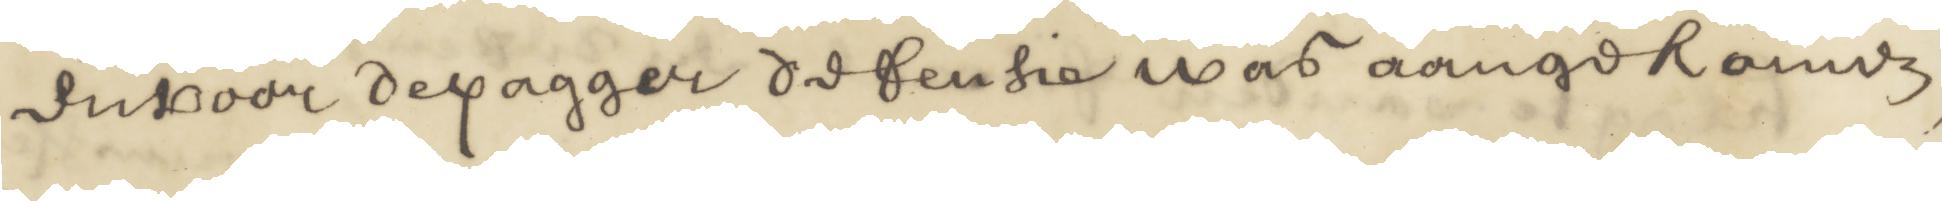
envoor depagger defensie was aangekomen
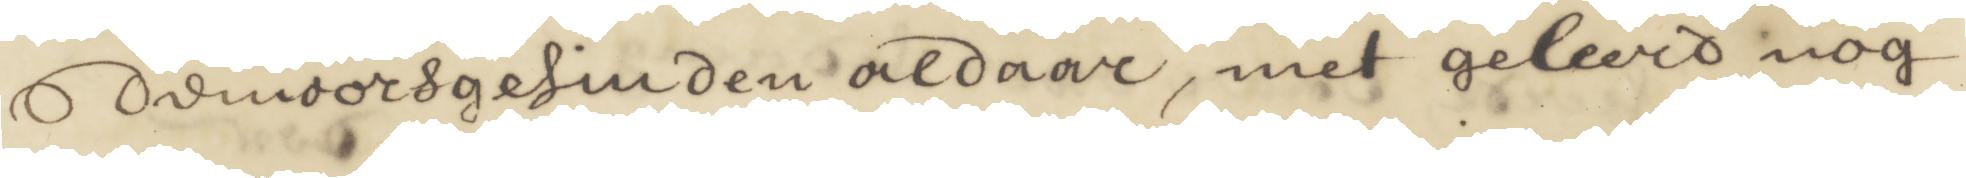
demoorsgesinden aldaar, niet geleerd, nog
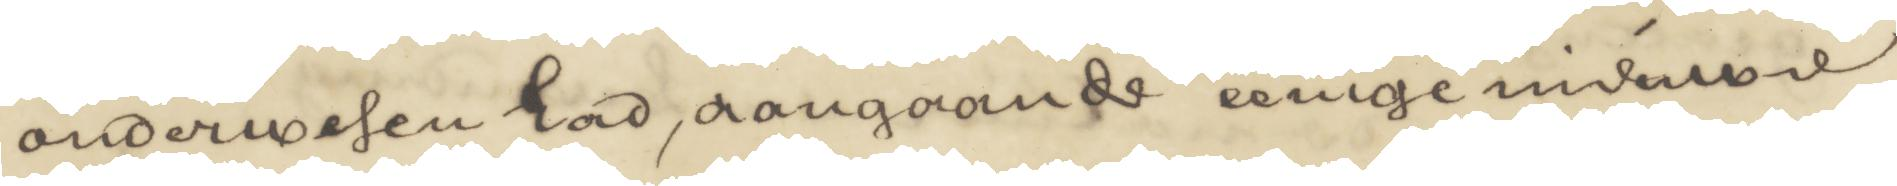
onderwesen had, aangaande eenige nieuwe
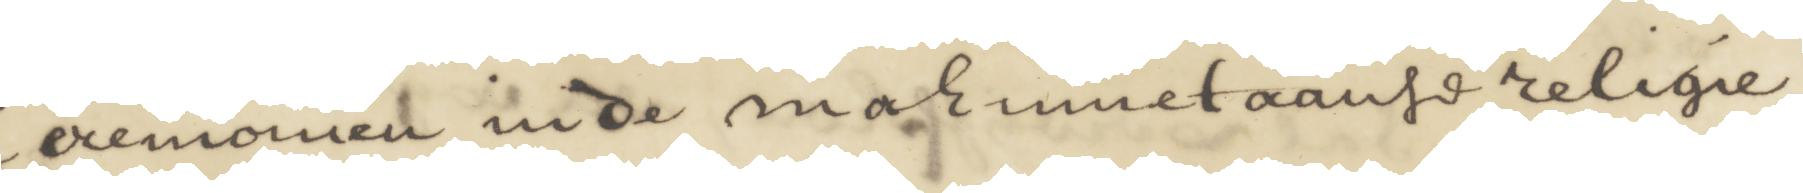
Ceremonien in de mahmetaanse religie
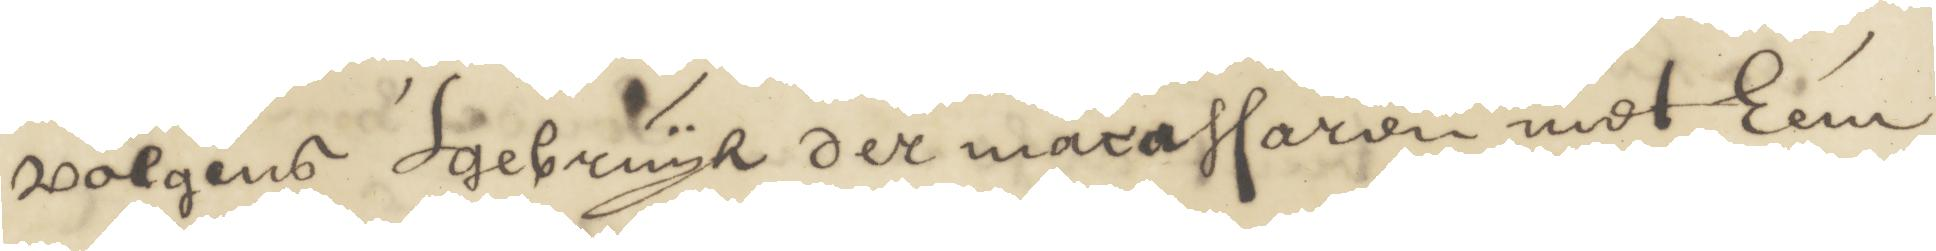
volgens 'tgebruijk der macassaren met hem
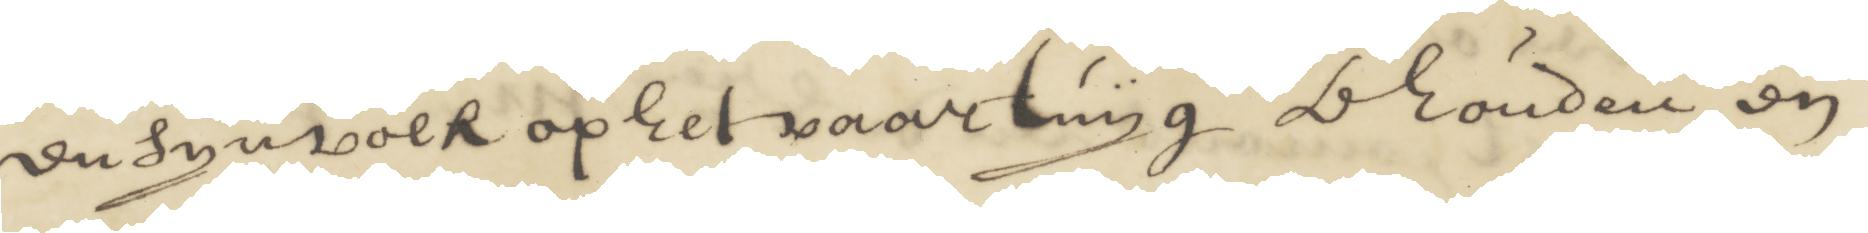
en syn volk op het vaartuijg te houden, en
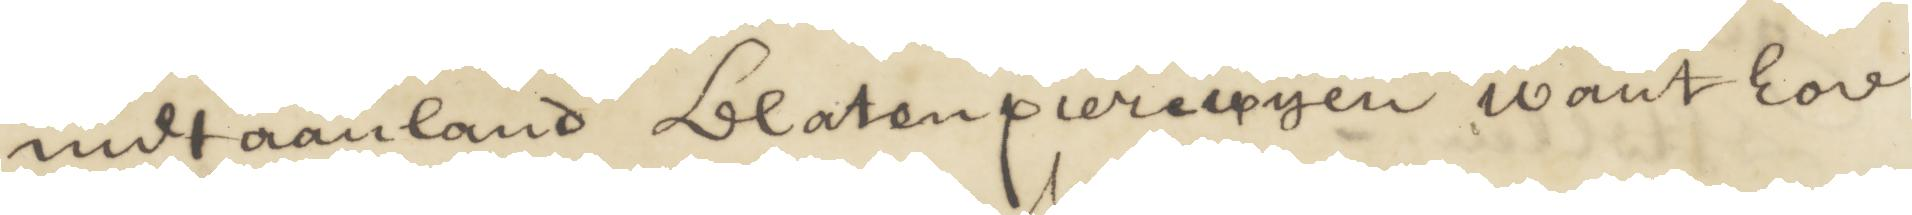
niet aanland telaten pierewijen want hoe
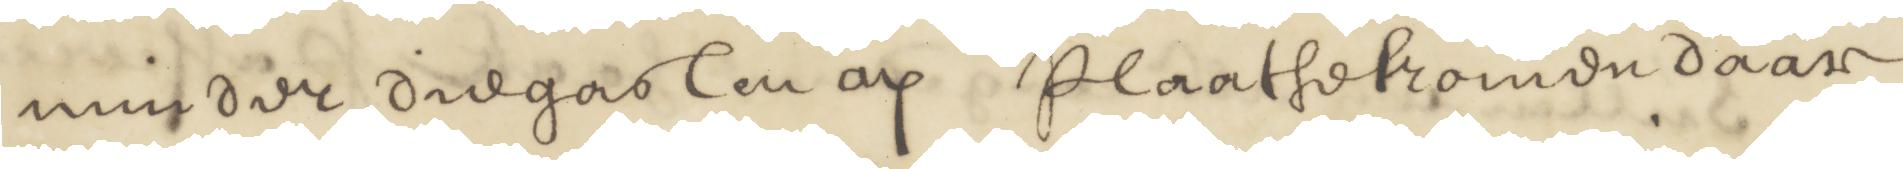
minder die gasten op Plaatse komen daar
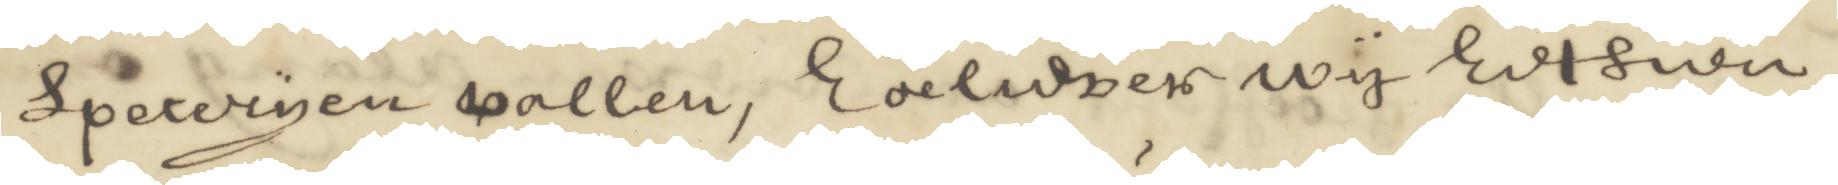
Specerijen vallen, hoeliever wij het sien,
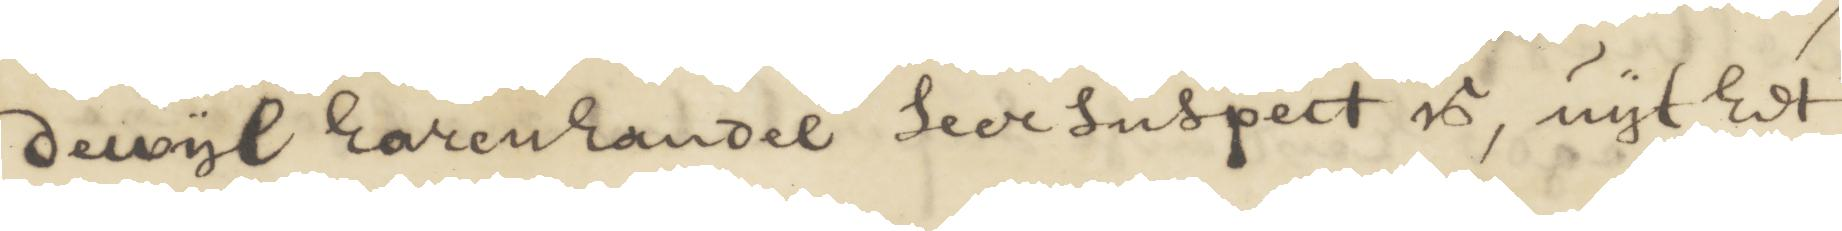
dewijl haren handel seer suspect is, uijt het
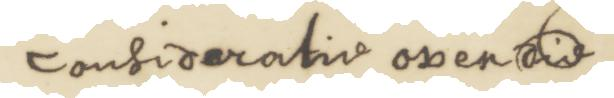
consideratie over die
